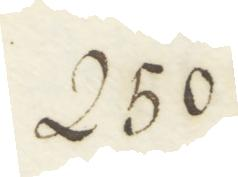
250
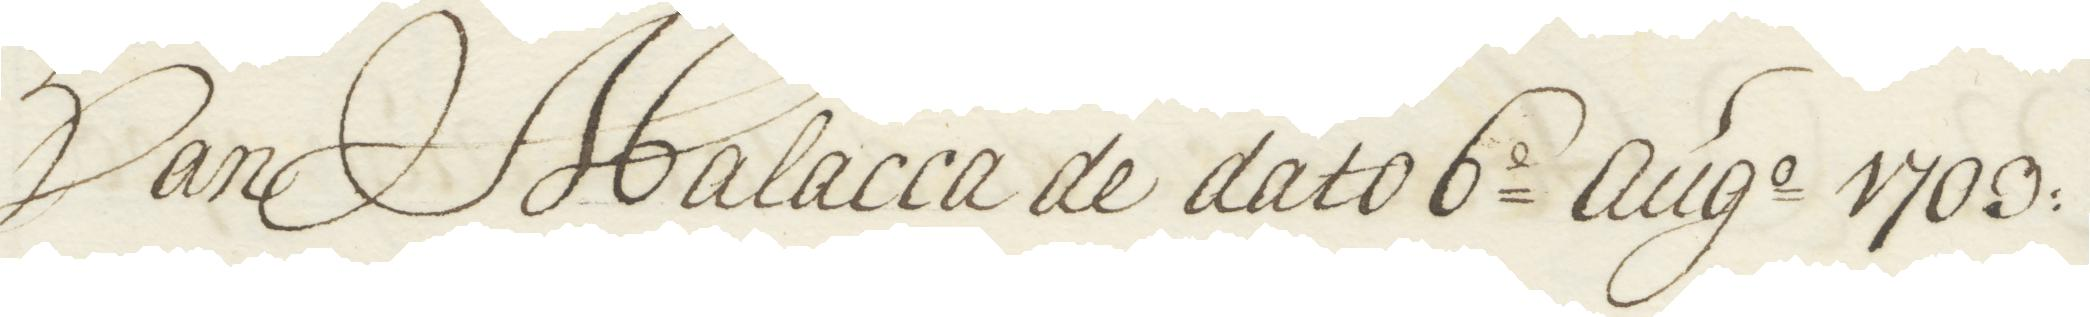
Van Malacca de dato 6=e aug=o 1703:
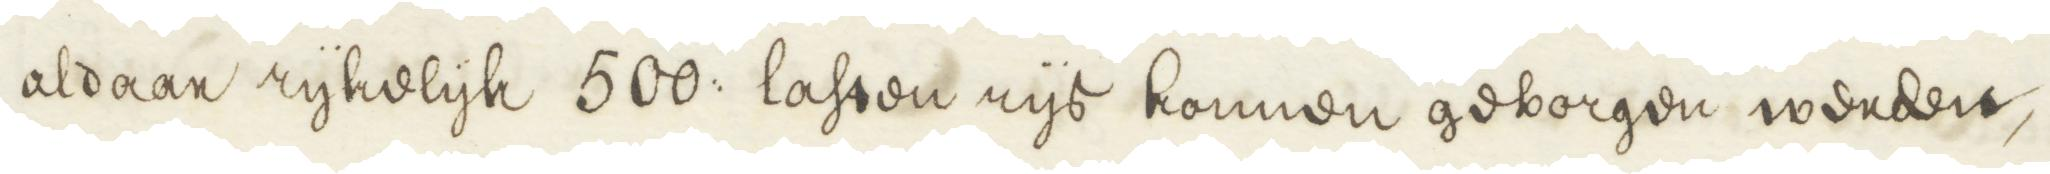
aldaar rijkelijk 500: lasten rijs konnen geborgen werden,
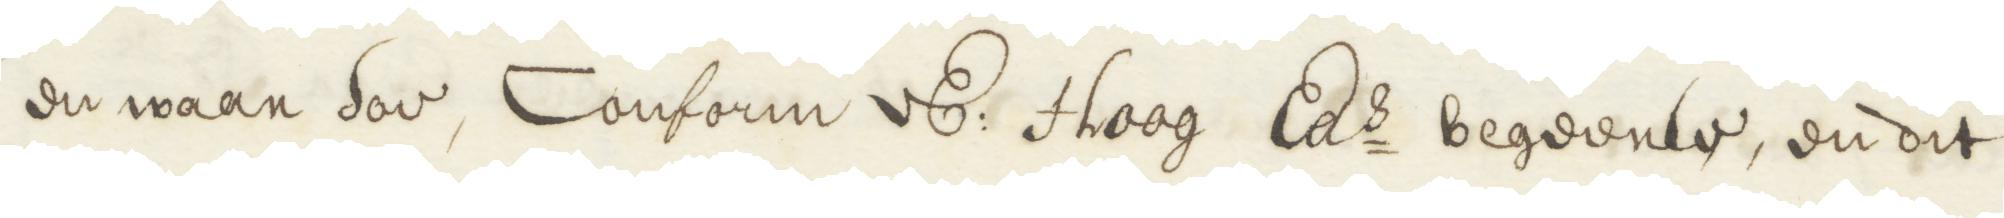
en waar toe, Conform vE: Hoog Ed=s begeerte, en dit
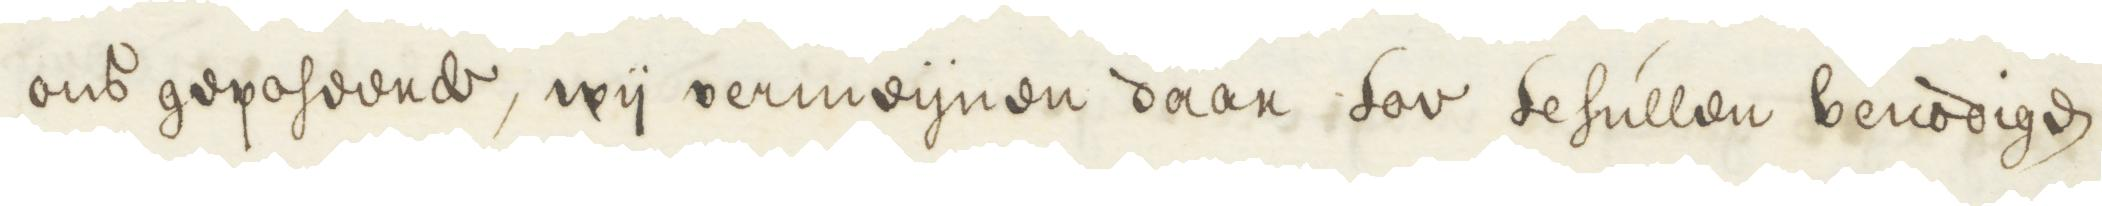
ons geposeerde, wij vermeijnen daar toe te sullen benodigen
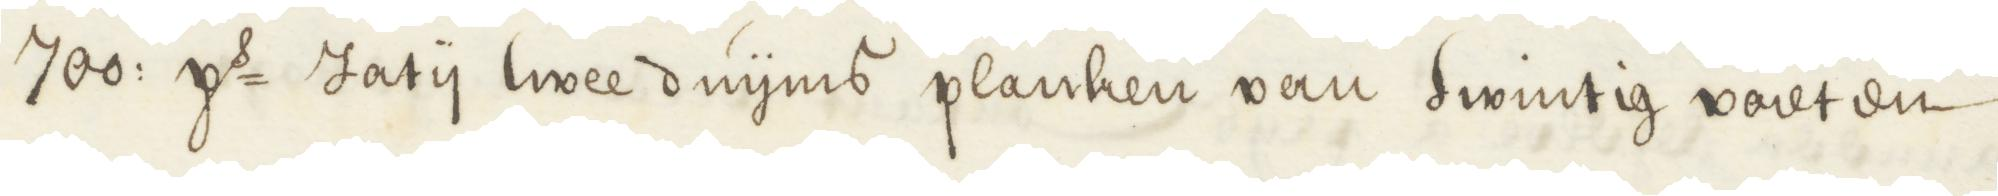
700: p=s Iatij twee duijms planken van twintig voeten
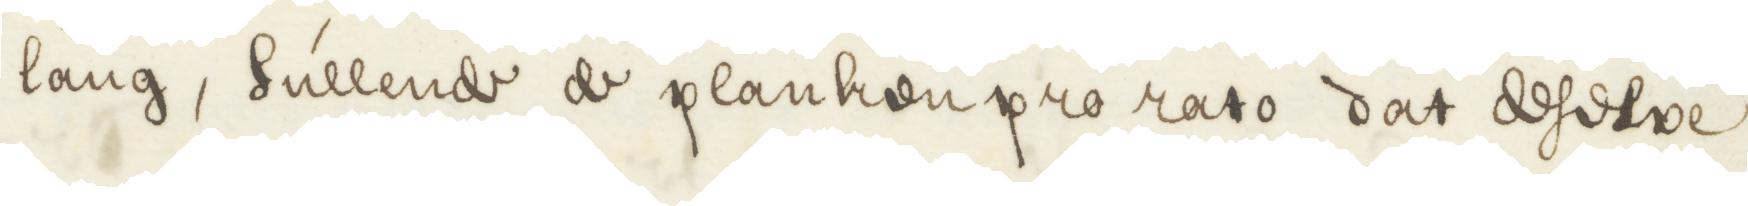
lang, sullende de planken pro rato dat deselve
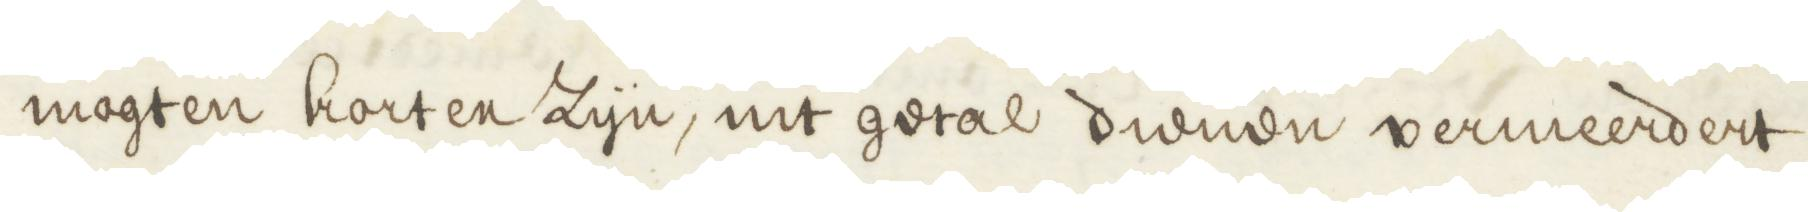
mogten korter zijn, in't getal dienen vermeerdert
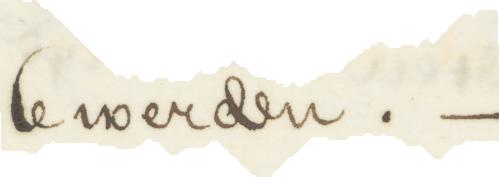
te werden.—
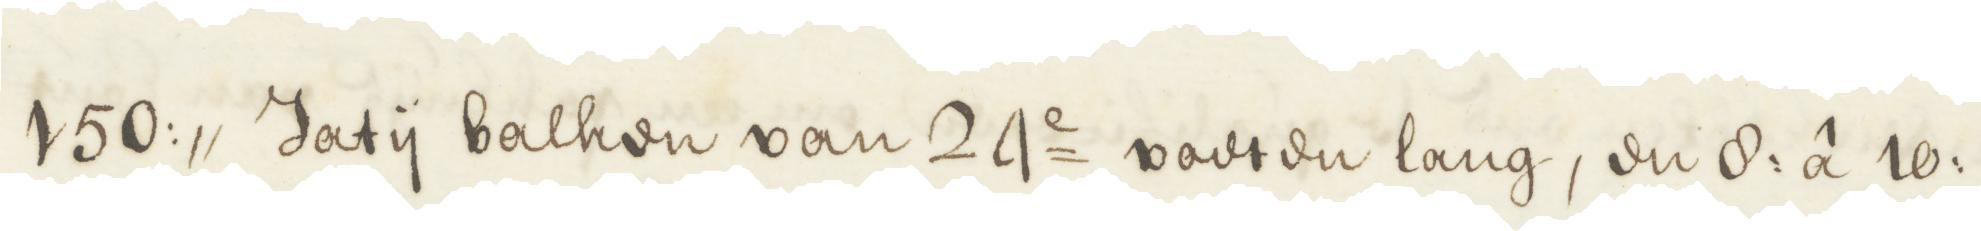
150: „ Iatij balken van 24=e voeten lang, en 8: â 10:
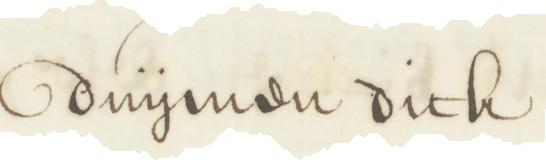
duijmen dick
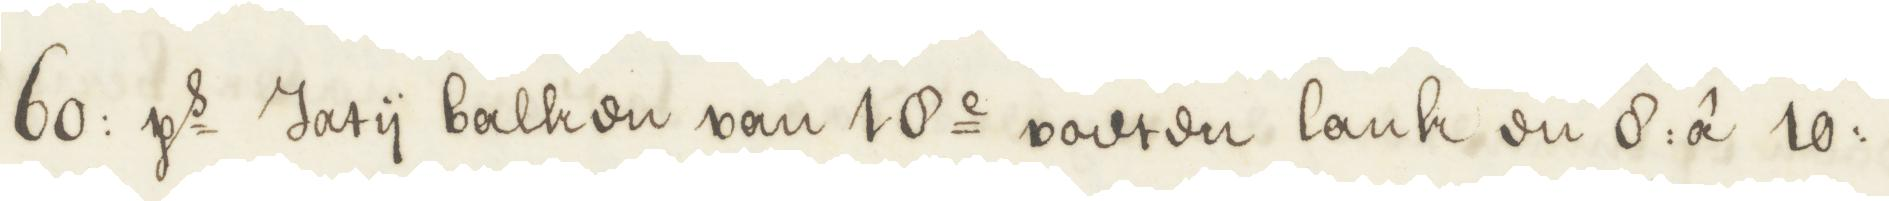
60: p=s Iatij balken van 18=e voeten lank en 8: â 10:
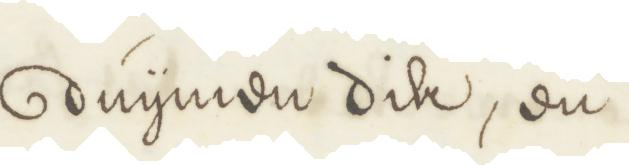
duijmen dik, en
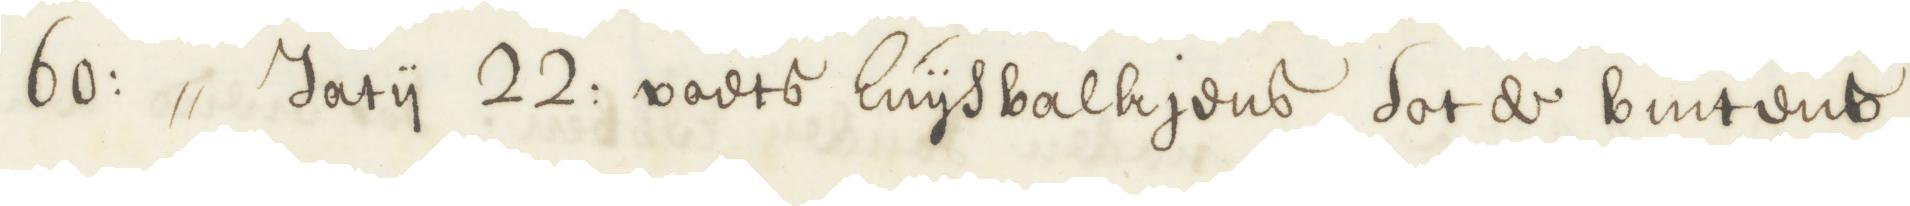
60: „ Iatij 22: voets huijsbalkjens tot de bintens
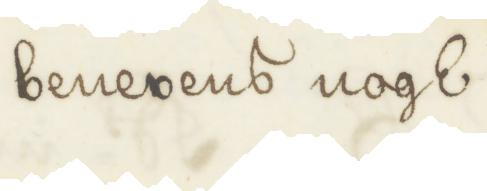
benevens nogh
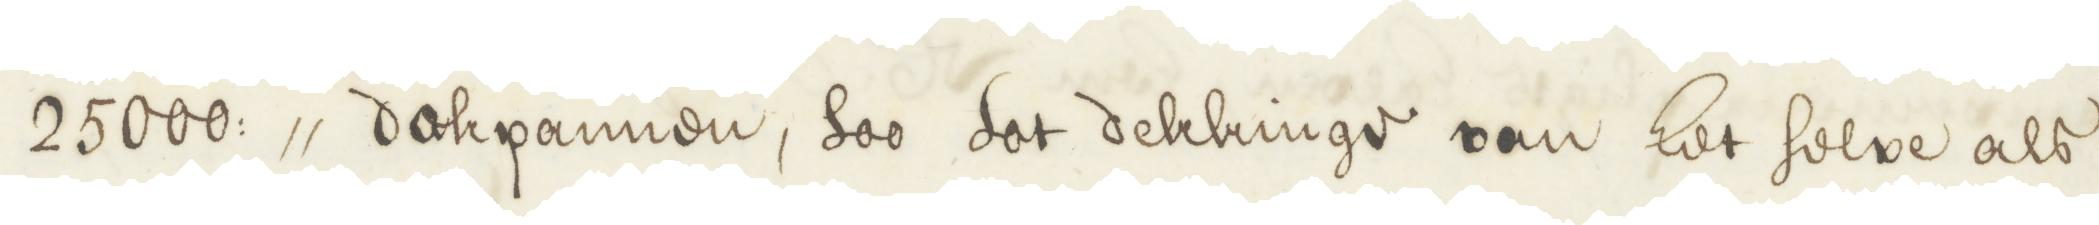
25000: „ dakpannen, soo tot dekkinge van het selve als
